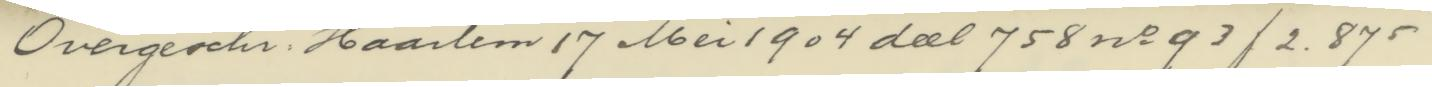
Overgeschr: Haarlem 17 Mei 1904 deel 758 n-o 93 ƒ 2. 875
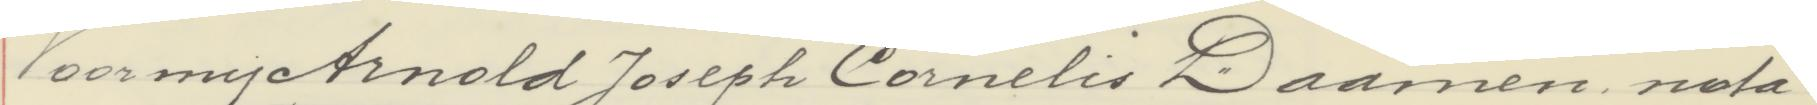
Voor mij Arnold Joseph Cornelis Daamen nota
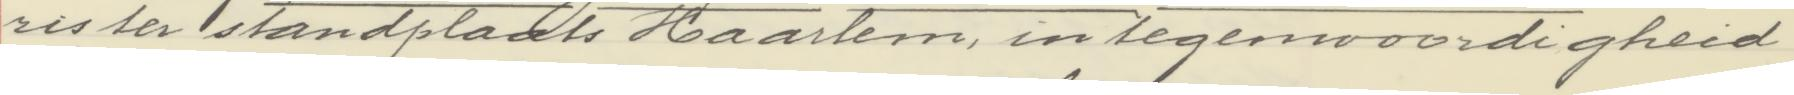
ris ter standplaats Haarlem, in tegenwoordigheid
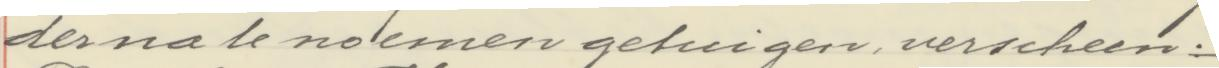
der na te noemen getuigen, verscheen:
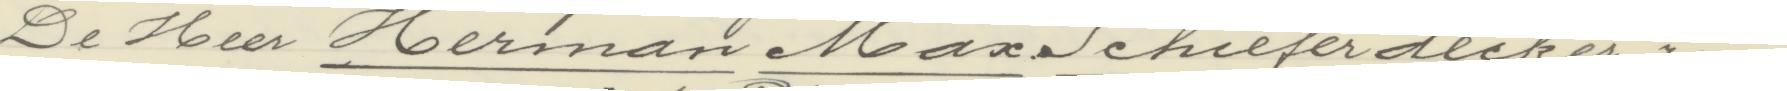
De Heer Herman Max Schieferdecker, zon
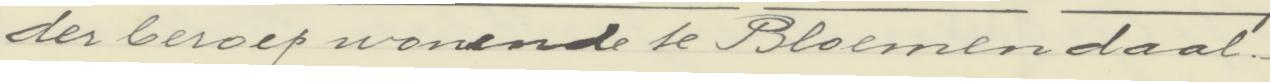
der beroep wonende te Bloemendaal.
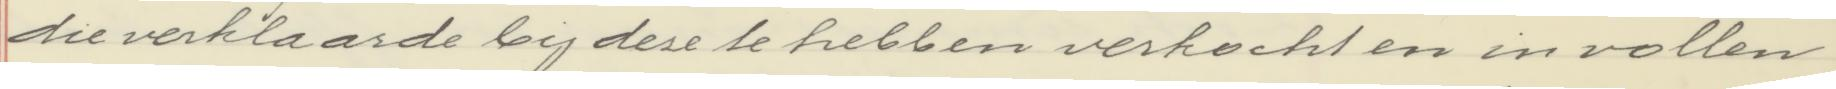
die verklaarde bij deze te hebben verkocht en in vollen
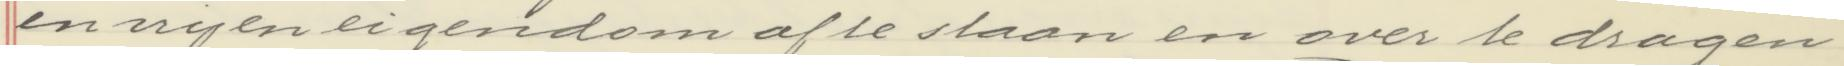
en vrijen eigendom af te staan en over te dragen
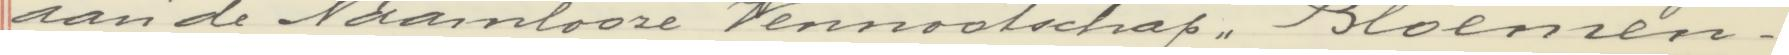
aan de Naamlooze Vennootschap „ Bloemen-
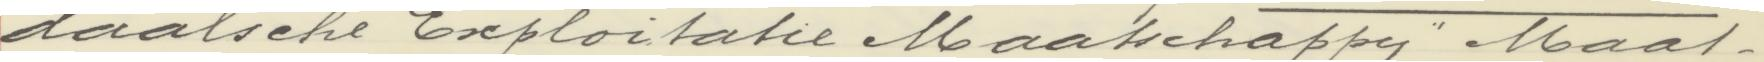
daalsche Exploitatie Maatschappy " Maat-
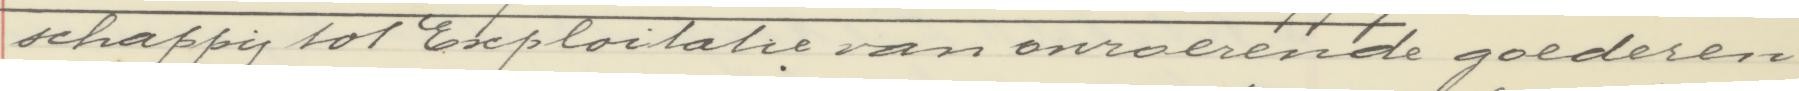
schappy tot Exploitatie van onroerende goederen
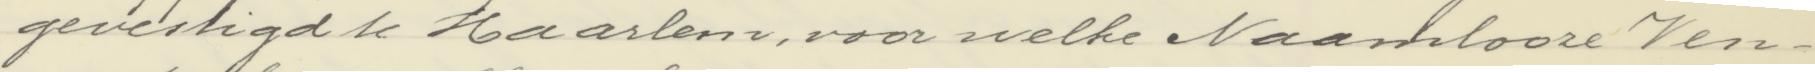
gevestigd te Haarlem, voor welke Naamlooze Ven-
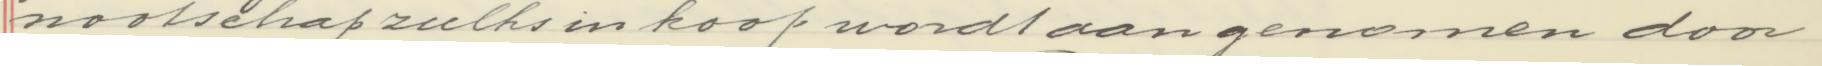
nootschap zulks in koop wordt aan genomen door
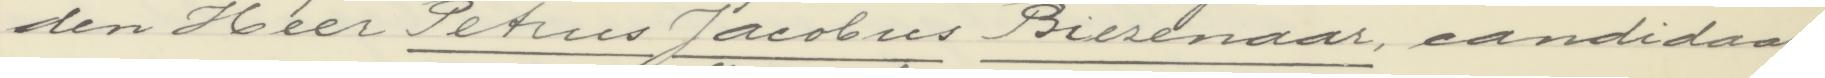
den Heer Petrus Jacobus Biezenaar, candidaat
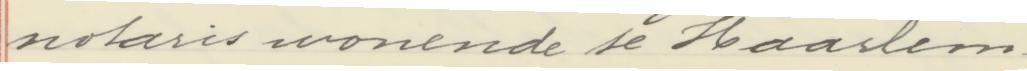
notaris wonende te Haarlem
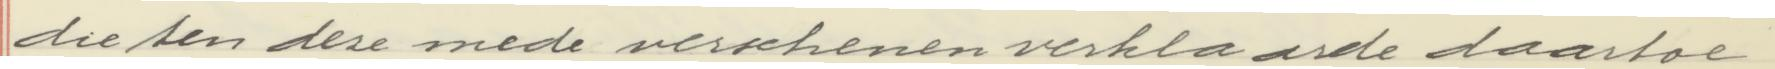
die ten deze mede verschenen verklaarde daartoe
